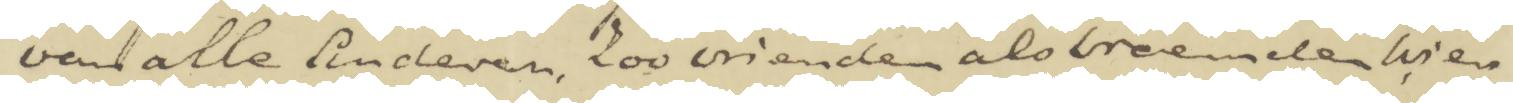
van alle Anderen, zoo vrienden als vreemden wier
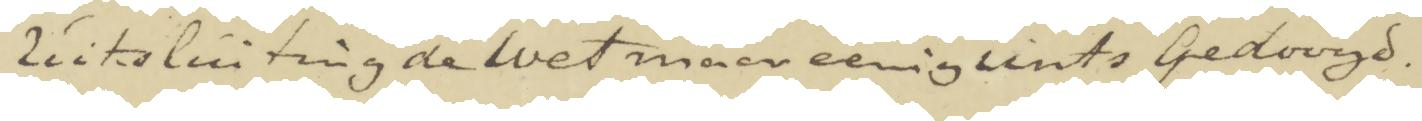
Uitsluiting de Wet maar eenigzints gedoogd.
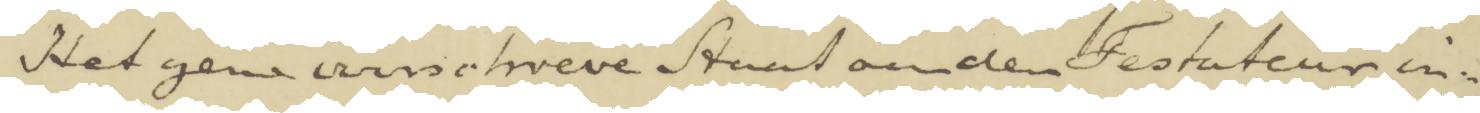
Het gene voorschreve staat aan de Testateur in
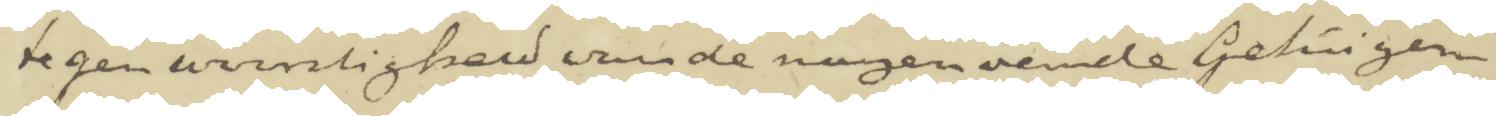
tegenwoordigheid van de nagenoemde Getuigen
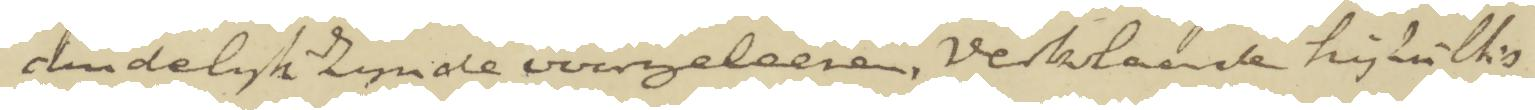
duidelyk zynde voorgeleezen, verklaarde hij zulks
